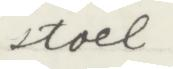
stoel
